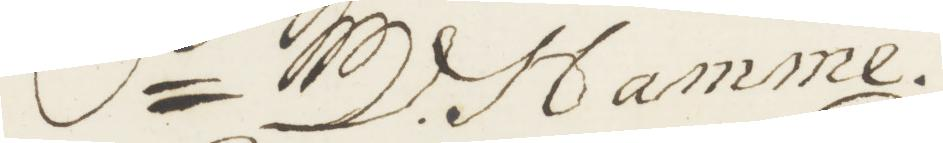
C=s V. Hamme.
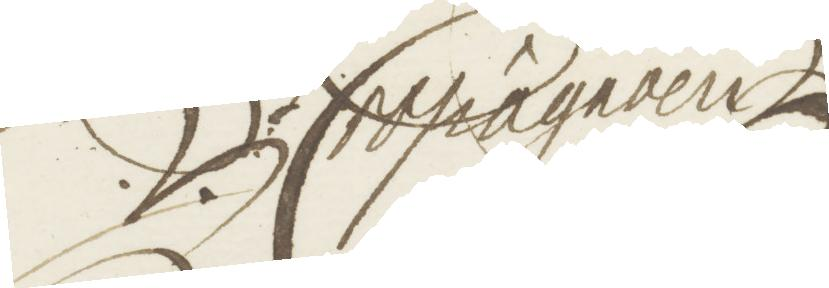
.V.sCropâgroen
